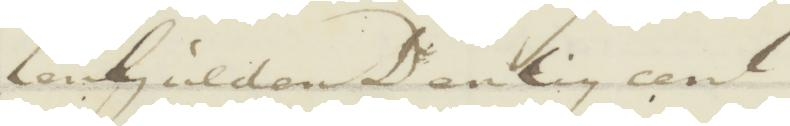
EenGulden Dertig cent
